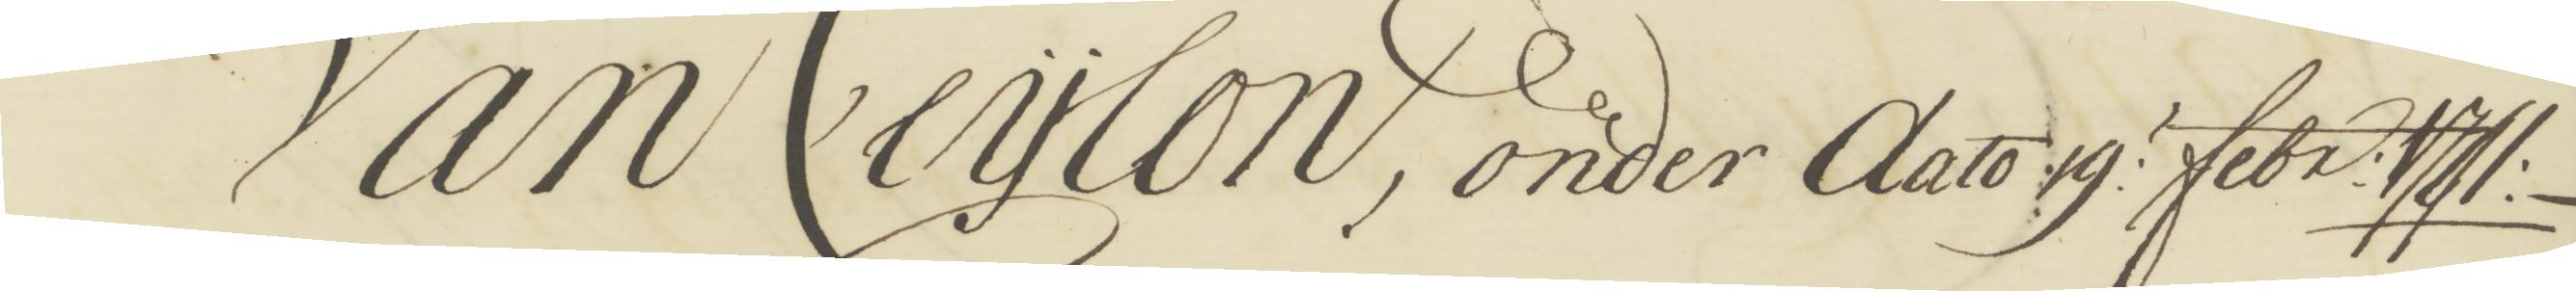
Van Ceijlon, onder Dato 19:' febr: 1741:—
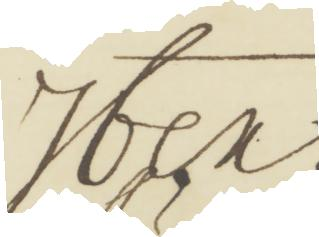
7ber
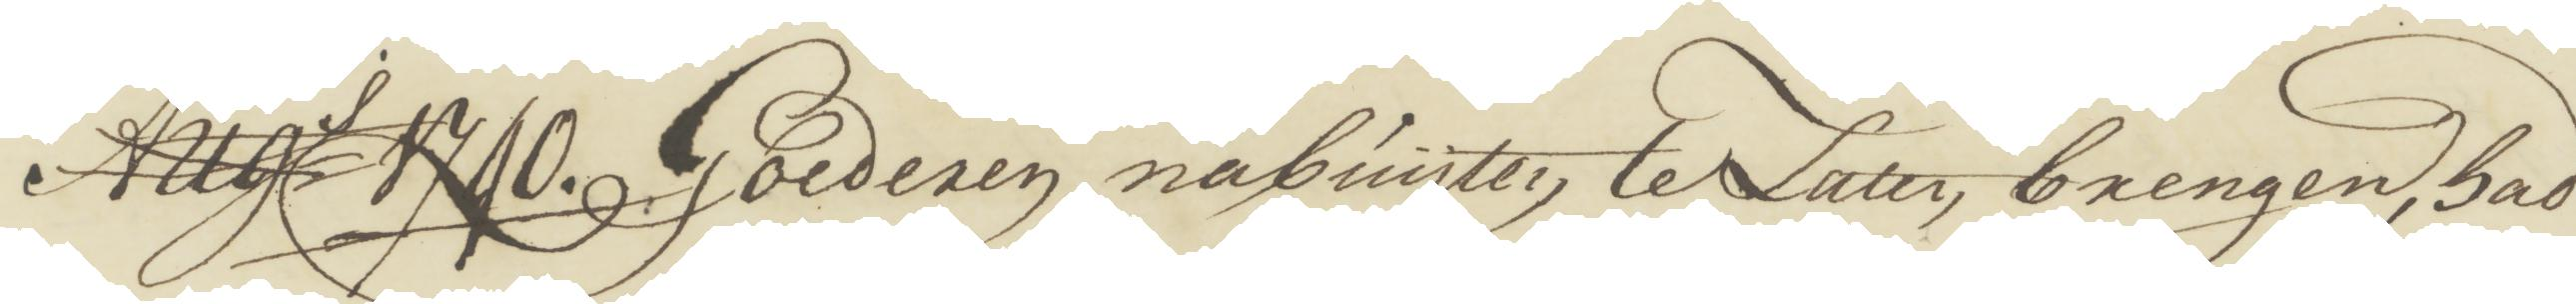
Aug=s 1740. Goederen nabuijten te Laten brengen, bad
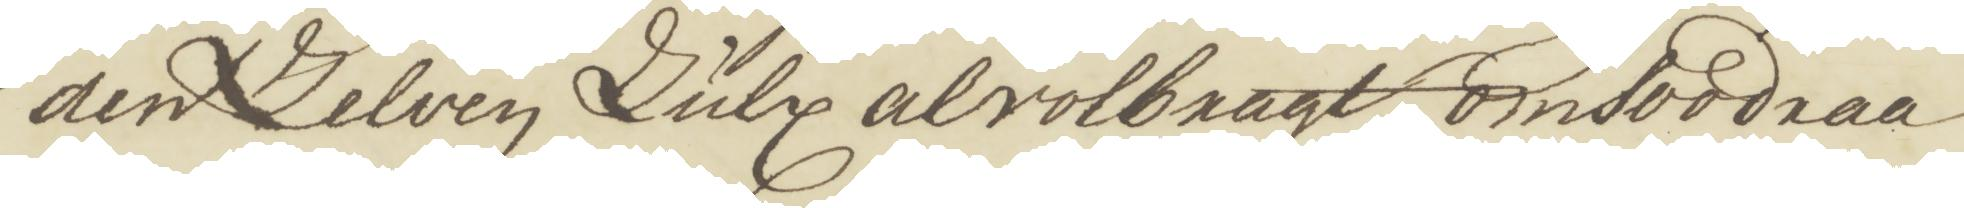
den zelven zulx al volbragt, om soodraa
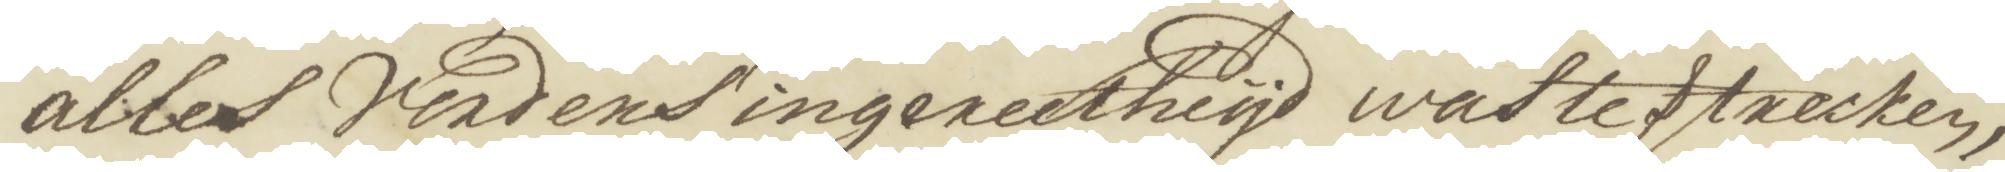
alles verders ingereetheijd was te vertrecken,
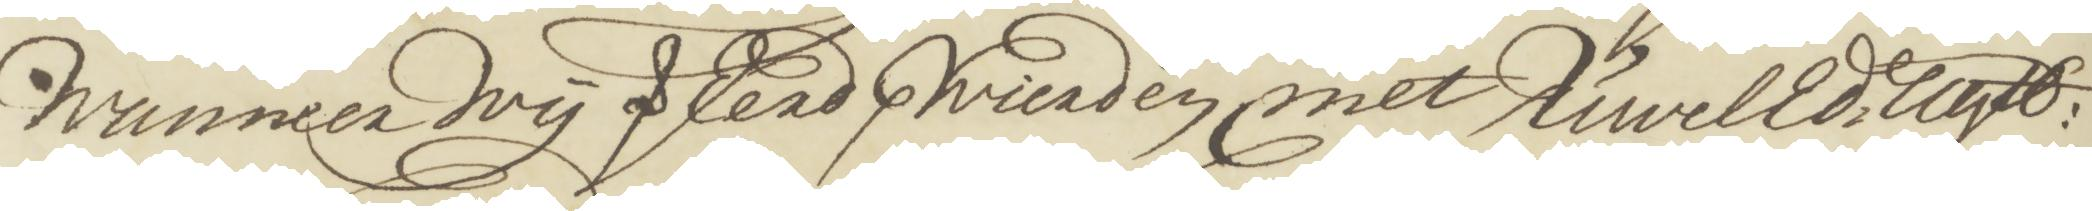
wanneer wij verEerd wierden met Uwel Ed:e Agtb:
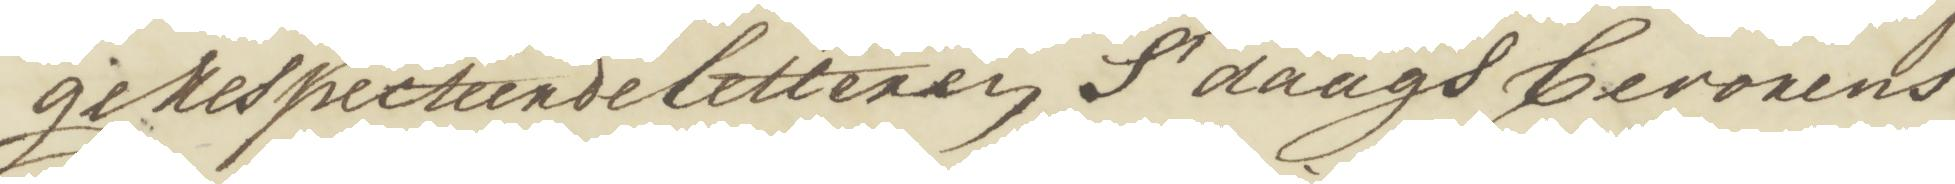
gerespecteerde letteren s' daags bevorens
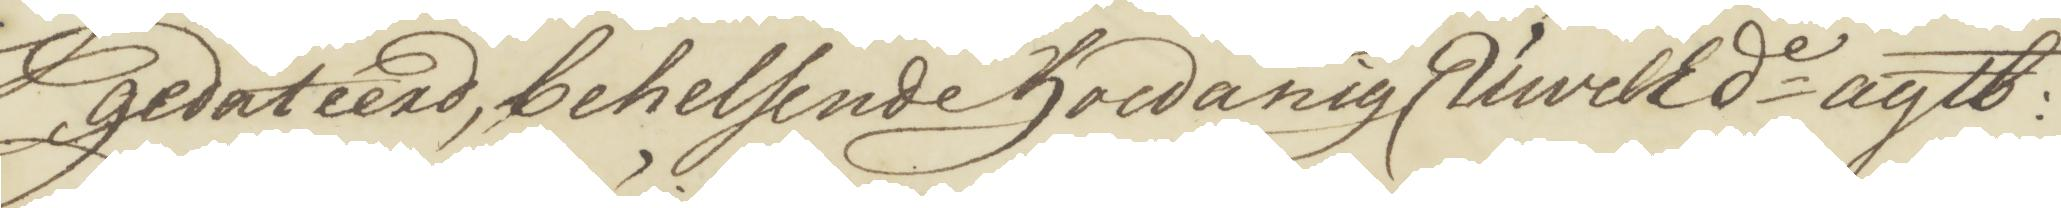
gedateerd, behelsende hoedanig Uwel Ed=e agtb:
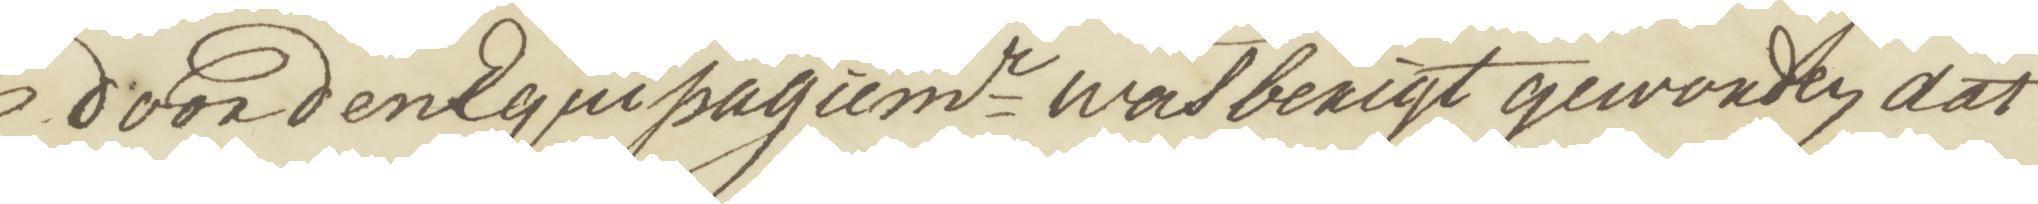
door den Equipagiem=r was berigt geworden dat
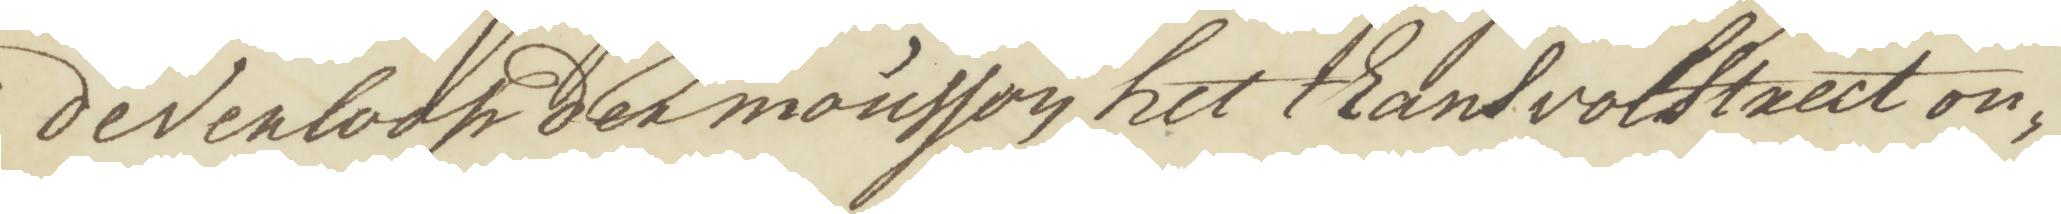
de verloop der mousson het thans volstrect on„
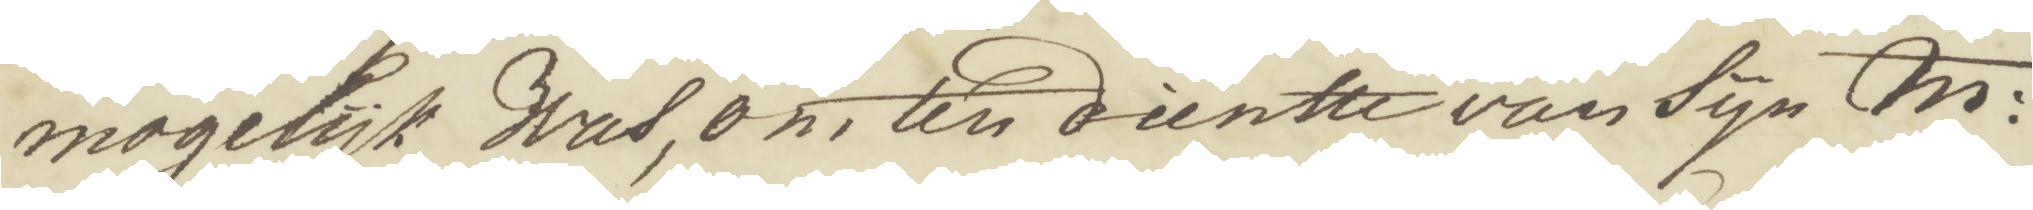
mogelijk was, om ten dienste van sijn m:
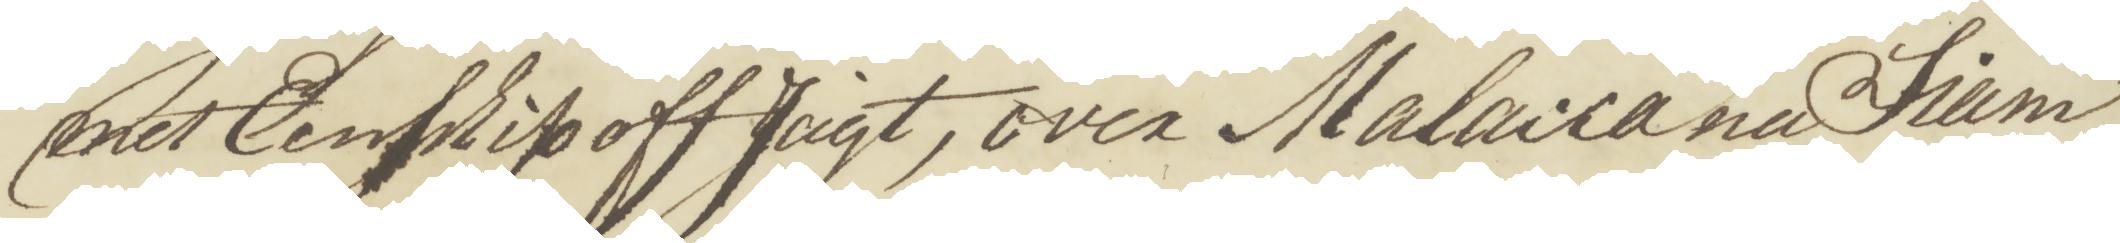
met Een schip off Jagt, over Malacca na Siam
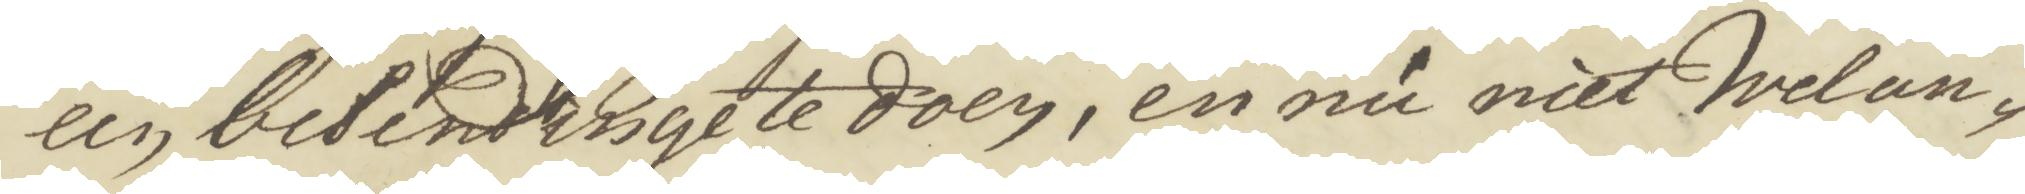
een besendinge te doen, en nu niet wel an„
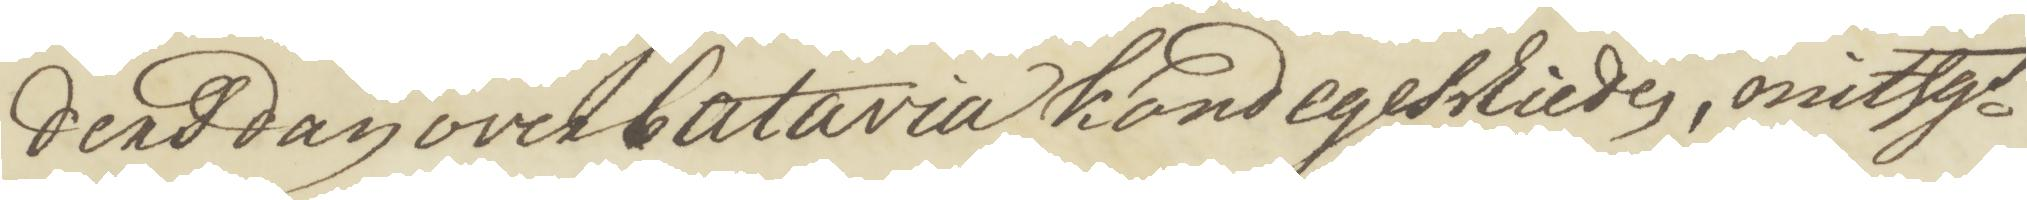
ders dan over batavia konde geschieden, mitsg=s
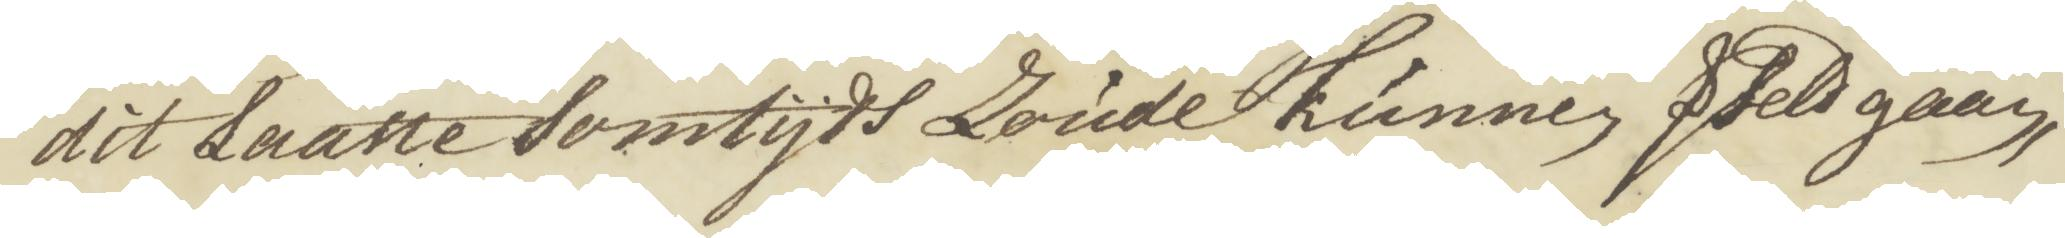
dit laaste somtijds zoude kunnen verseld gaan,
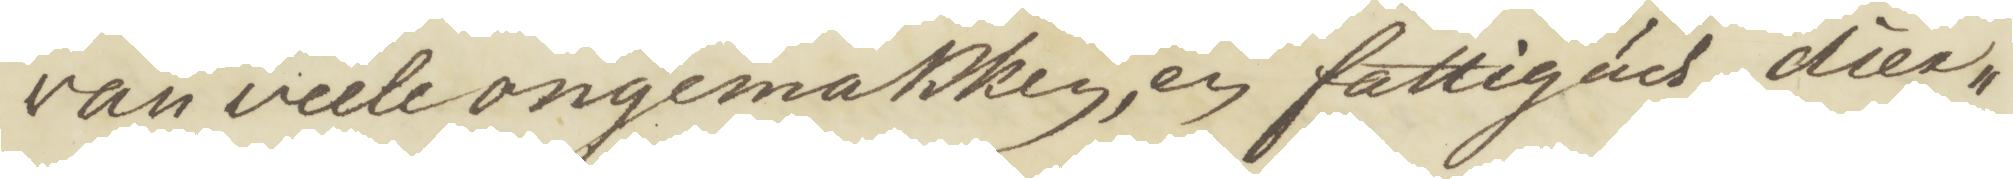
van veele ongemakken, en fattigues, dier„
